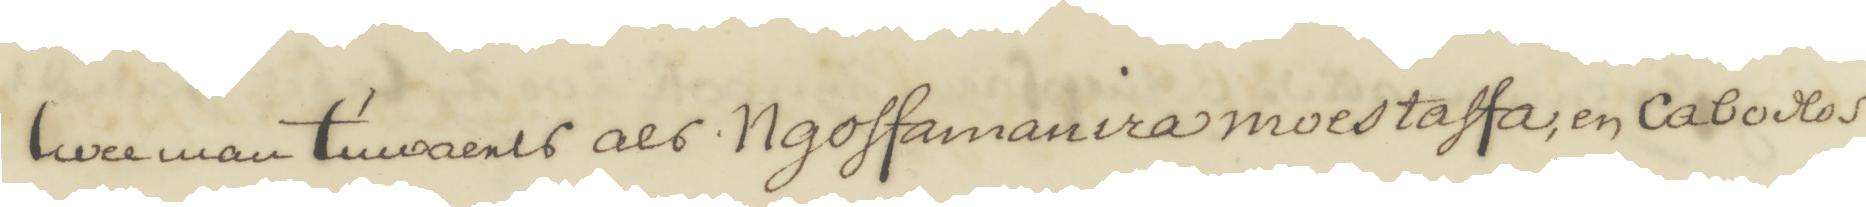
twee man t'uwaerts als Ngoffamanira moestaffa, en Caboeloe
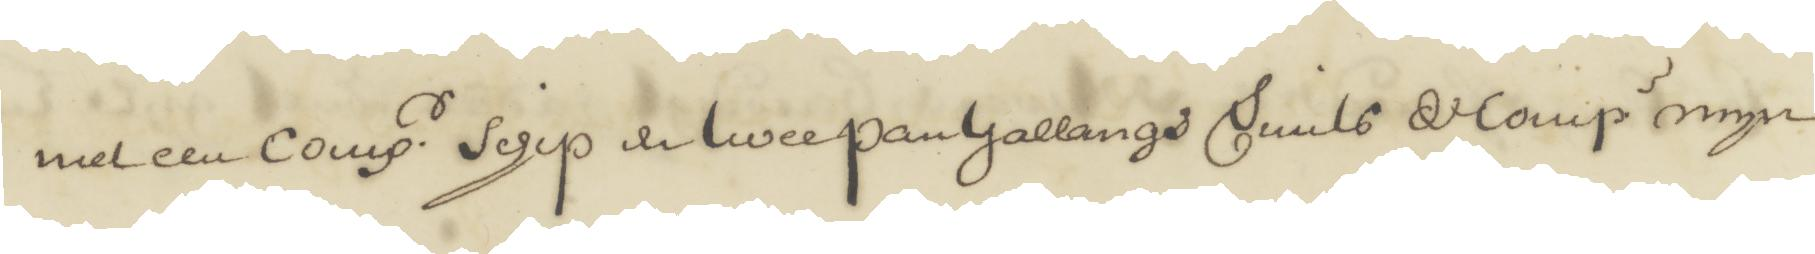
met een Comp:s schip en twee pantjallangs vermits de Comp.s myn
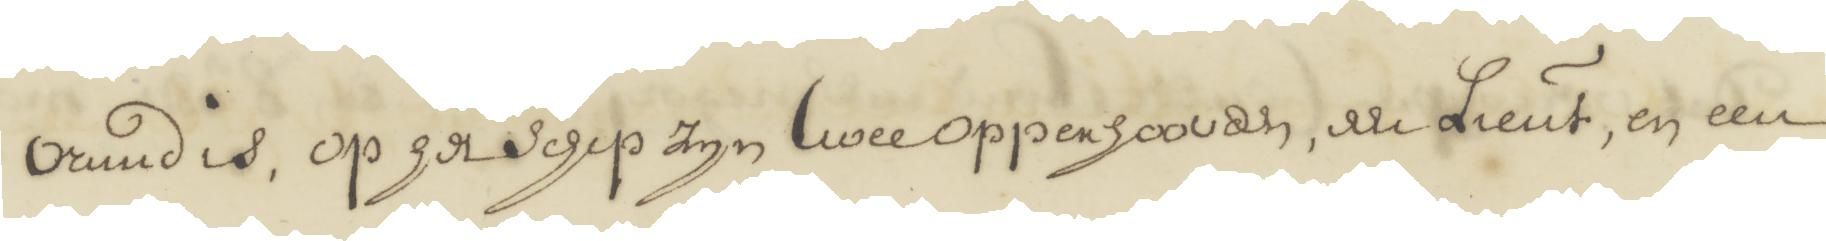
vrund is, op het schip zyn twee opperhoovden, een Lieut, en een
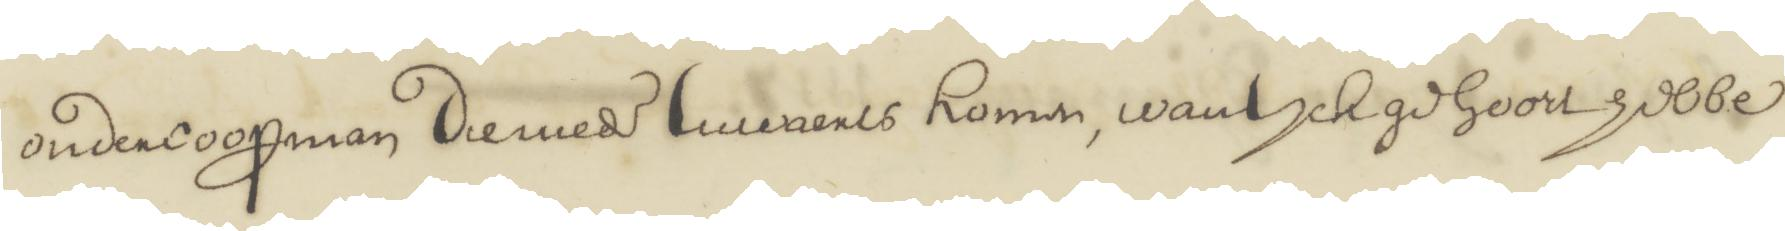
onder coopman die mede tuwaerts komen, want jck gehoort hebbe
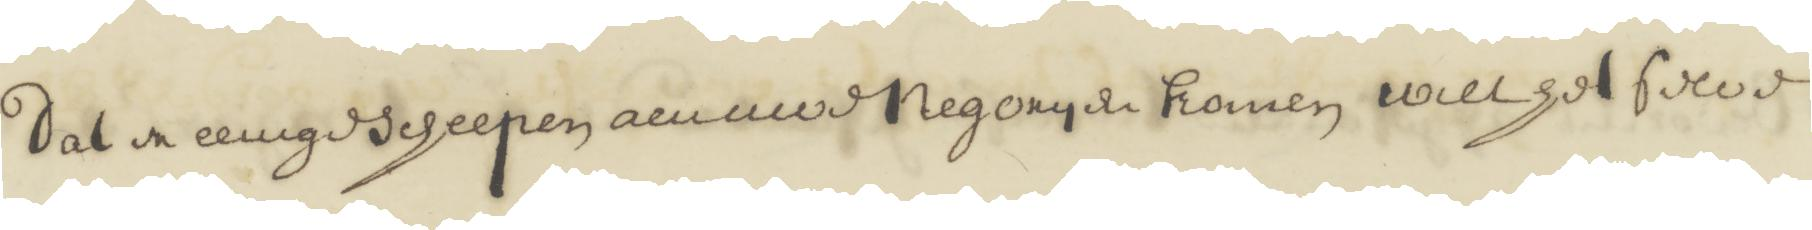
dat er eenige scheepen aen uwe Negoryen komen wilt het selve
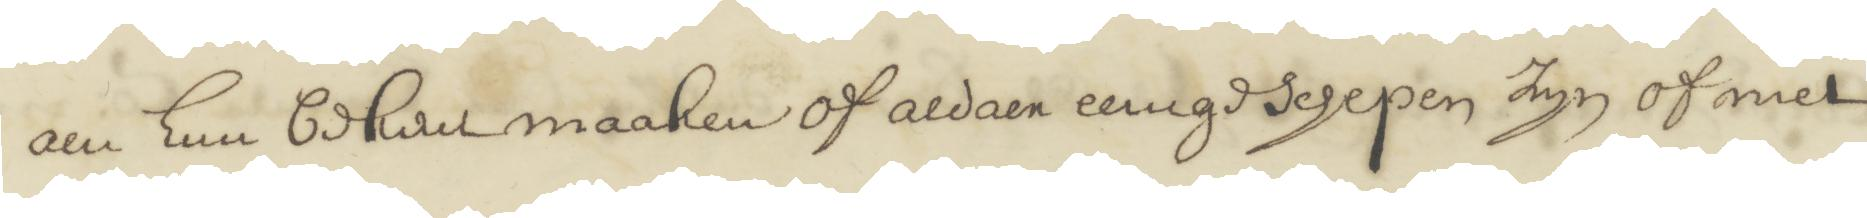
aen hun bekent maaken of aldaer eenige schepen zyn of niet
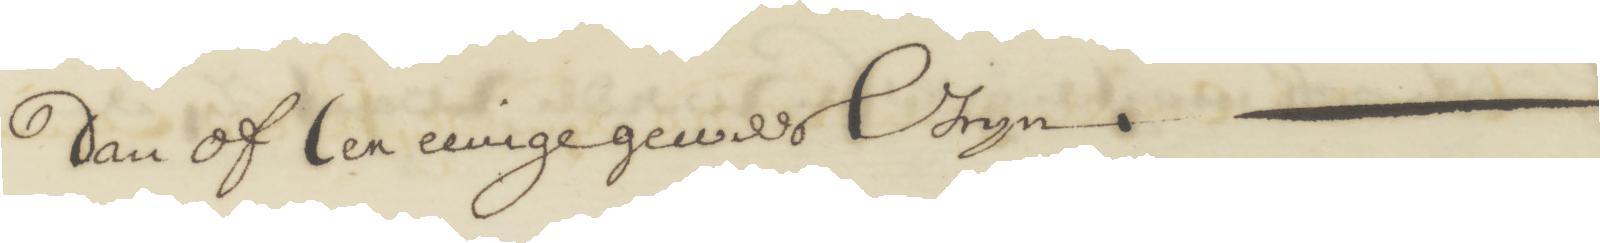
dan of ter eenige geweest zyn.—
